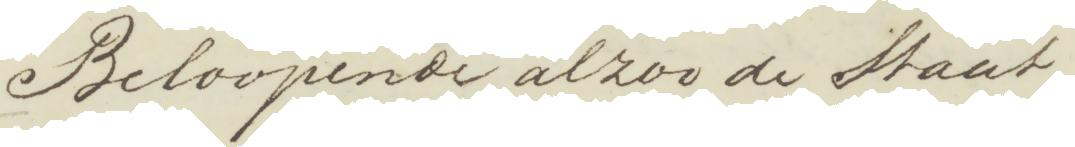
Beloopende alzoo de Staat
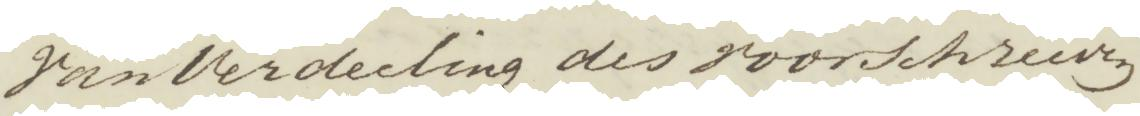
Van Verdeeling des voorschreeven
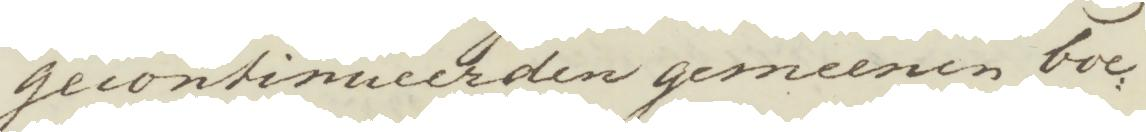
gecontinueerden gemeenen boe:
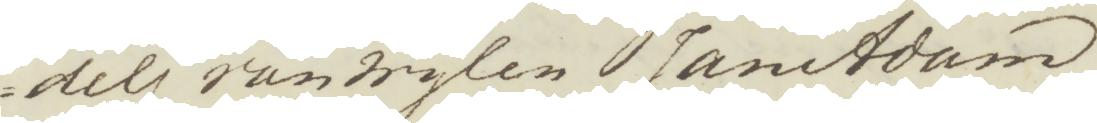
=dels van wylen JanAdam
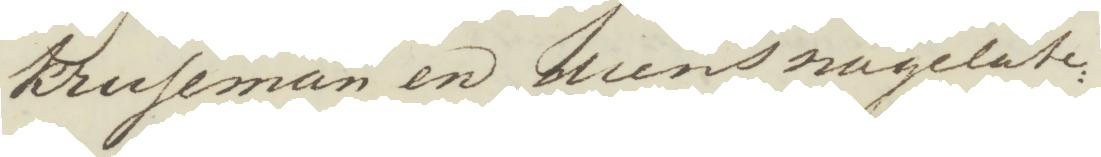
Kruseman en diens nagelate:
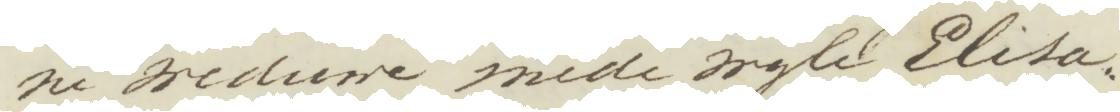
ne weduwe mede wyle Elisa„
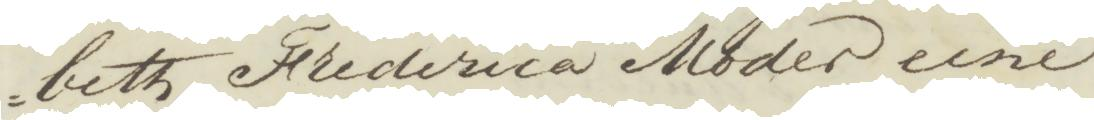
=beth Frederica Moder eene
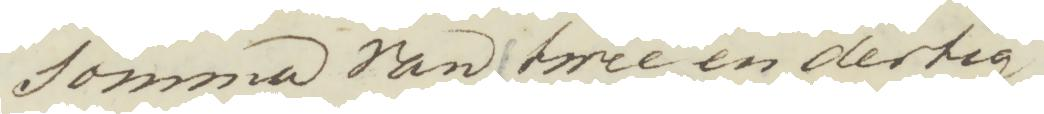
somma van twee en dertig
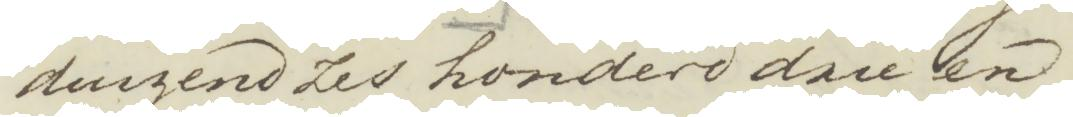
duizend zes honderd drie en
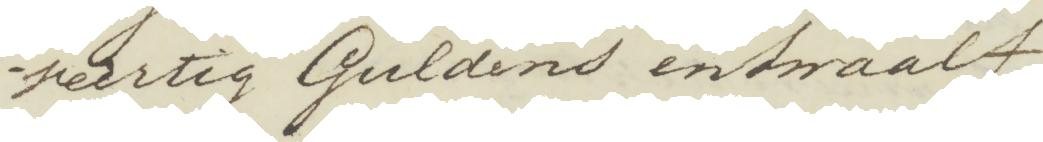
veertig Guldens en twaalf
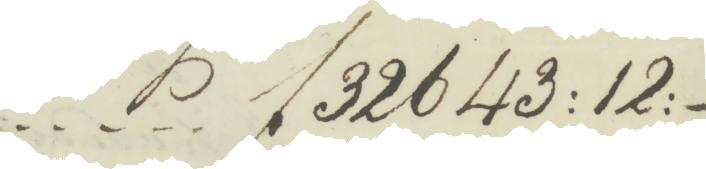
- - - - - ƒ 32643: 12:-
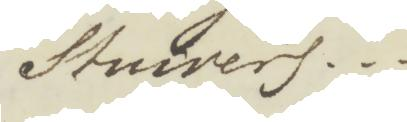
stuivers - -
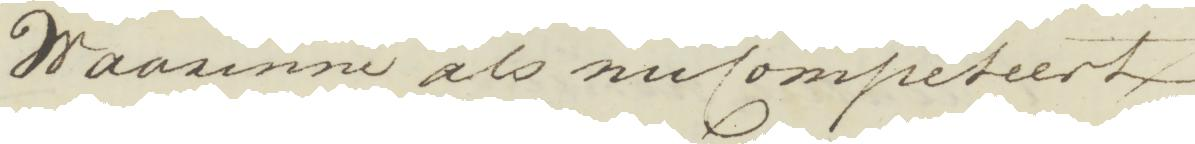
Waarinne als nu competeert
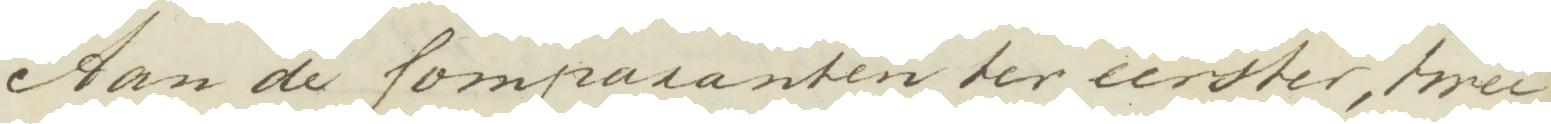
Aan de Comparanten ter eerster, twee
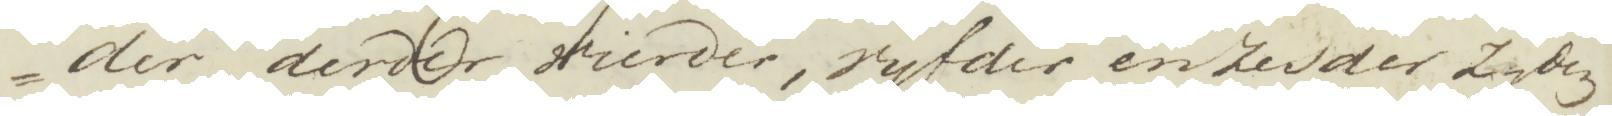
=der, derder, vierder, vyfder en zesder zyden
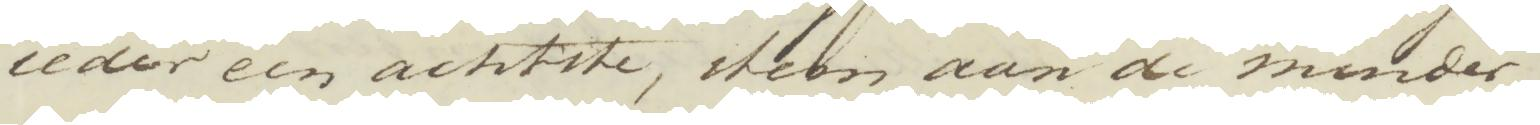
ieder een achtste, item aan de minder
